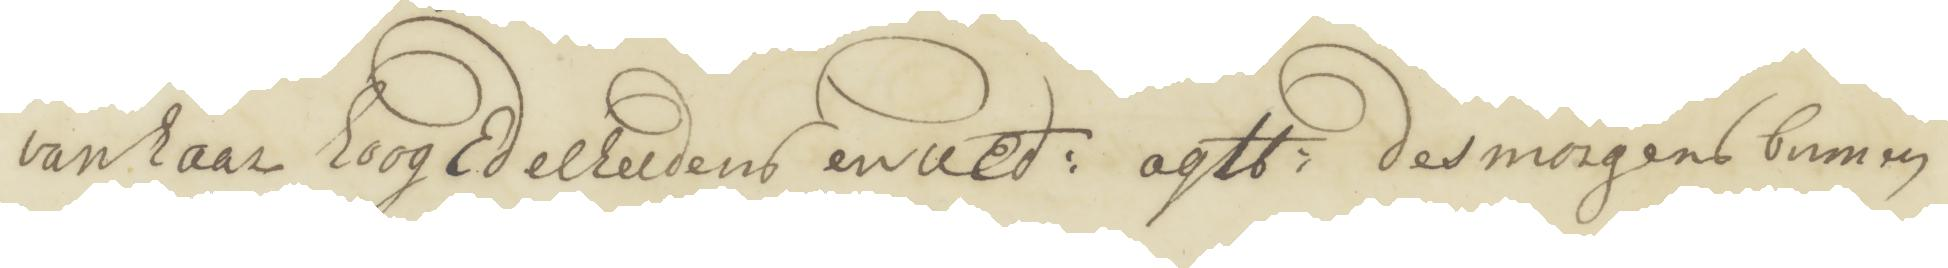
van haar hoog Edelheedens en uEd: agtb: des morgens binnen
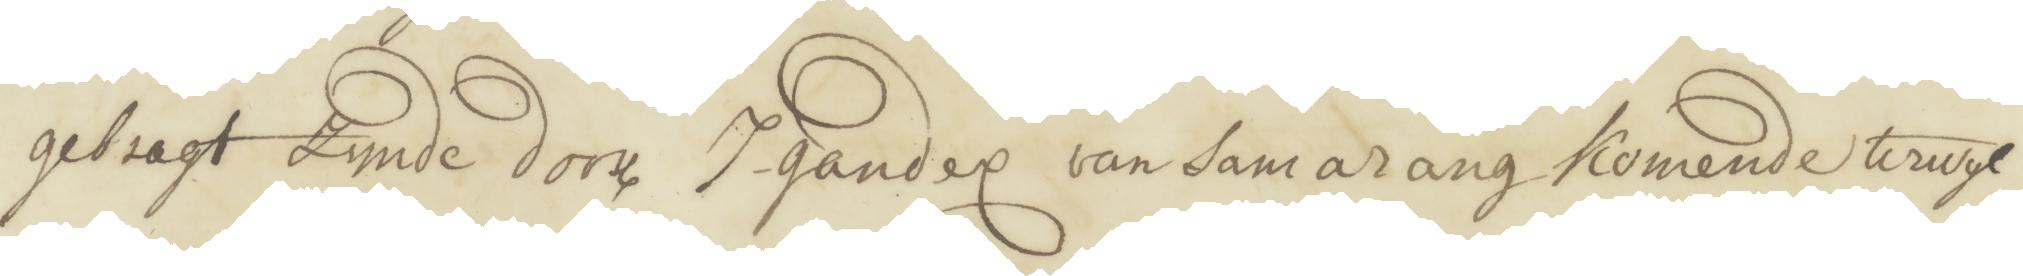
gebragt zynde door 7-gandex van samarang komende terwyl
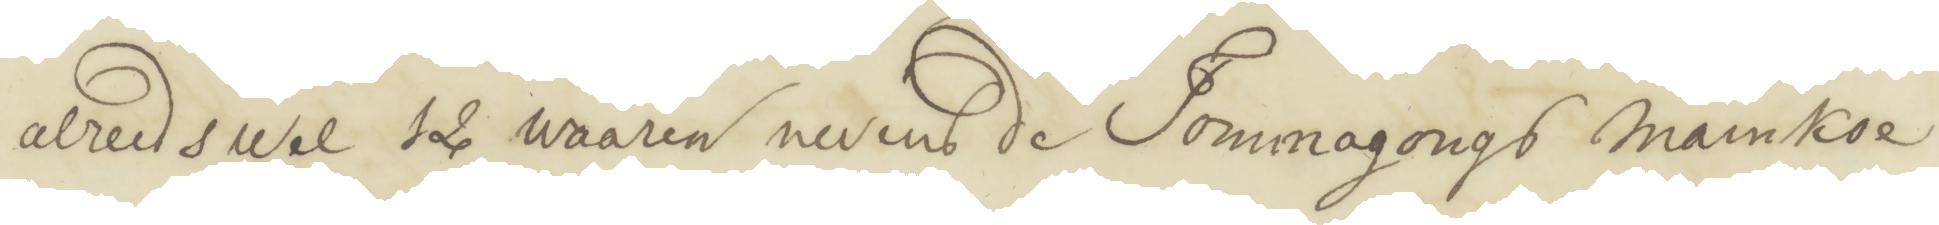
alreeds wel 12 waaren nevens de Tommagongs mainkoe
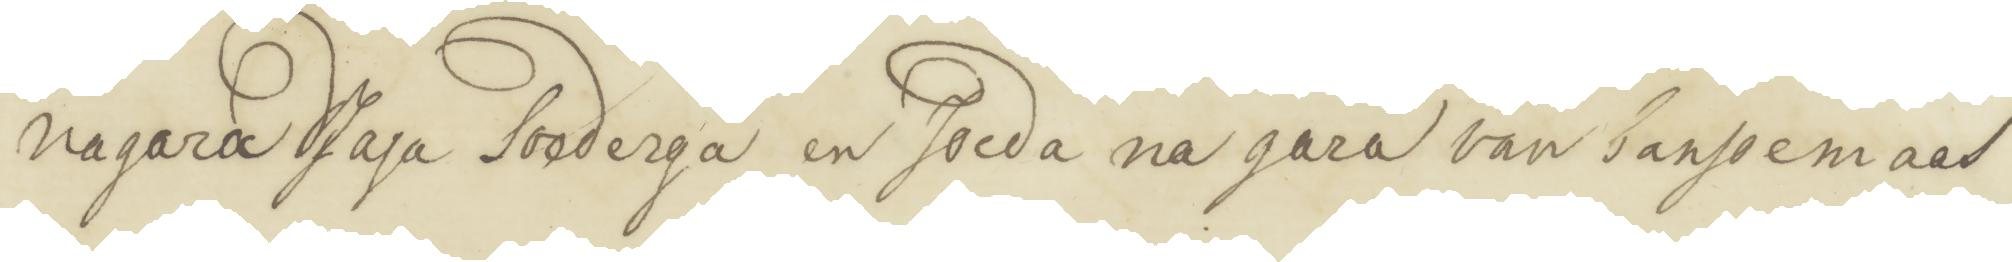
nagara djaja soederga en Joeda na gara van barsoemaas
